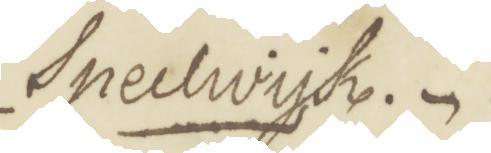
speelwijk. -
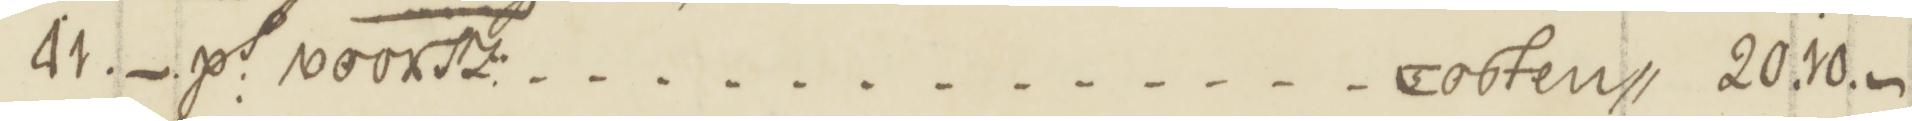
41.-. p:s voorsz: . . . . . . . . . . . . . costen„ 20. 10.-
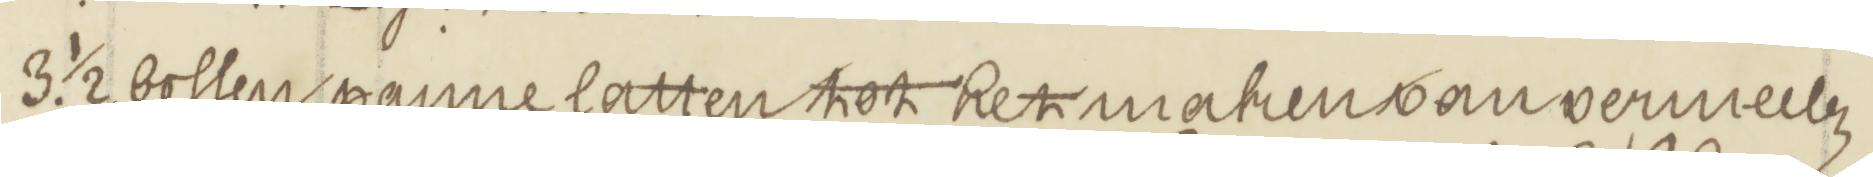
3.½. bossen panne latten tot het maken van vermeelen
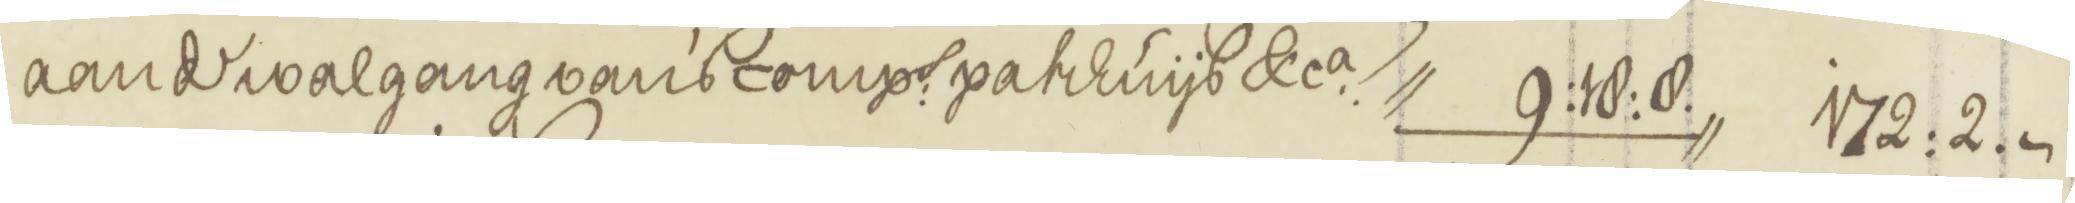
aan de walgang van ’s comp:s pakhuijs & c:a „ 9: 18: 8: „ 172: 2.-
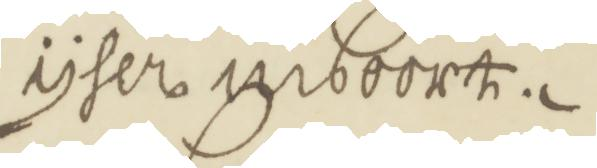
ijser in soort.-
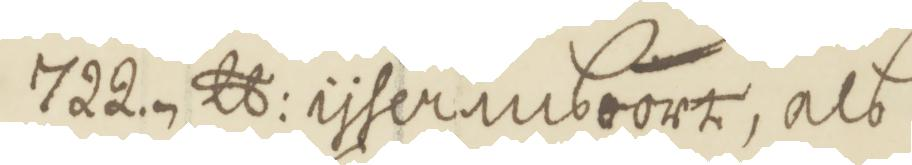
722.- lb: ijser in soort, als
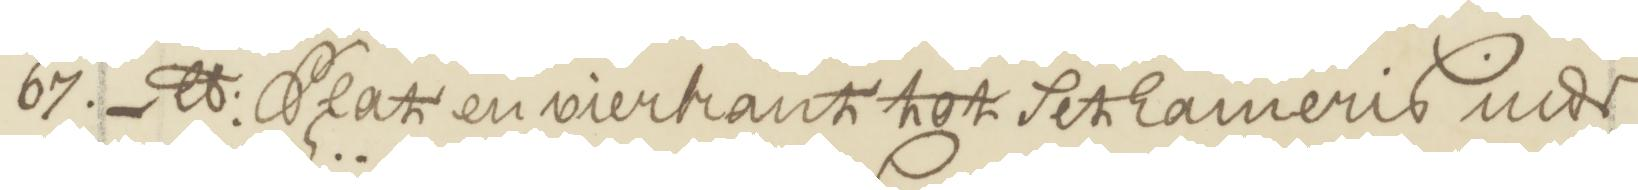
67._ lb: Plat en vierkant tot sethameris inde
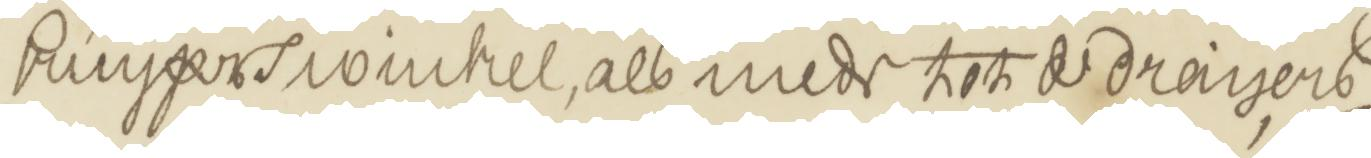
kuijpers winkel, als mede tot de draijers
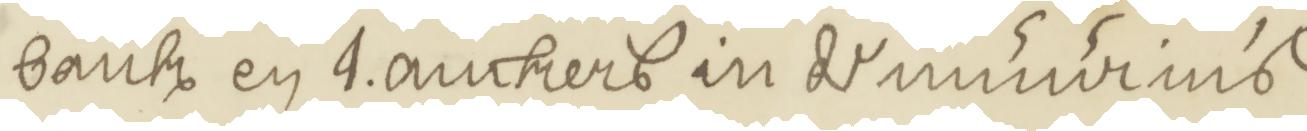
bank en 4. anckers in de muur in’s
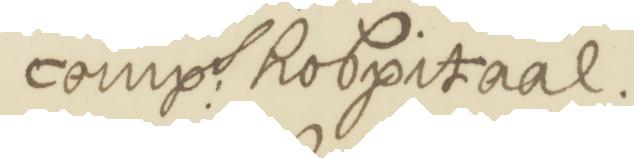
comp:s hospitaal.
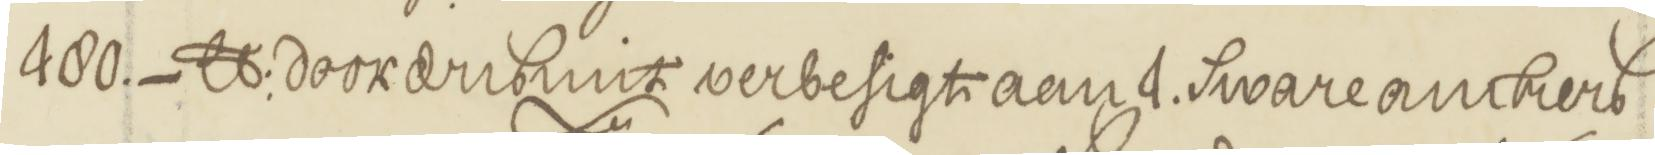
480.- lb: door den smit verbesigt aan 4. sware anckers
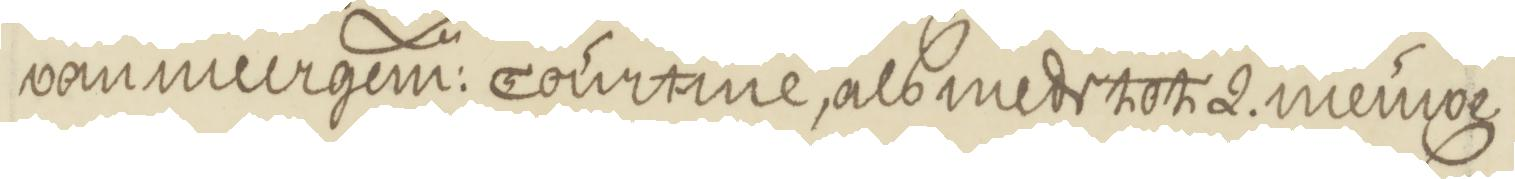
van meergem:n courtine, als mede tot 2. nieuwe
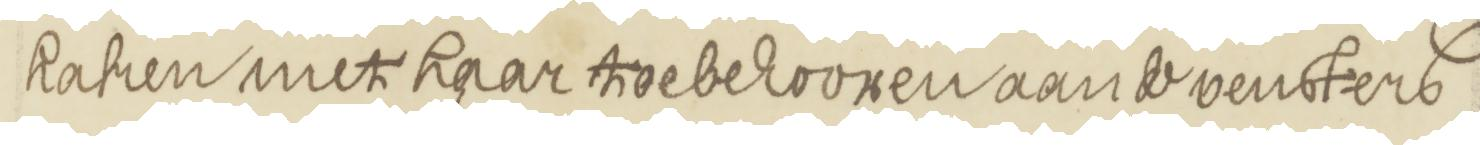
haken met haar thoebehooren aan de vensters
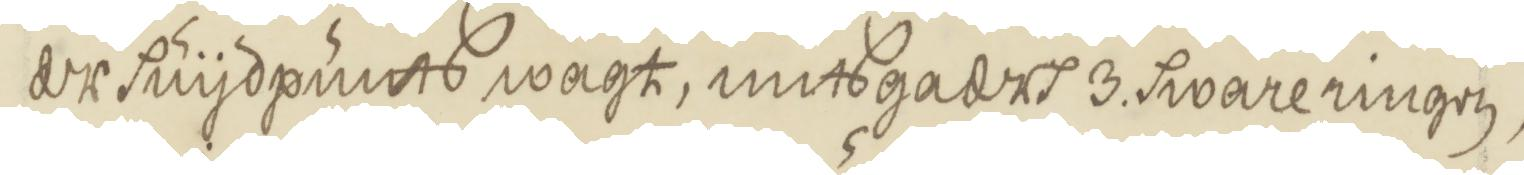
der suijdpunts wagt, mitsgaders 3. sware ringen
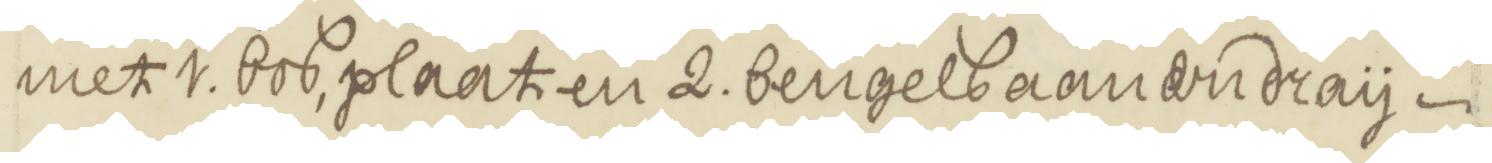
met 1. bos, plaat en 2. beugels aan den draij —
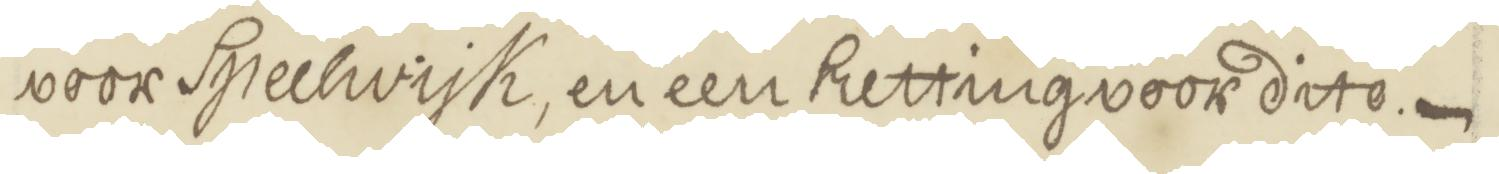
voor speelwijk, en een ketting voor dito. —
